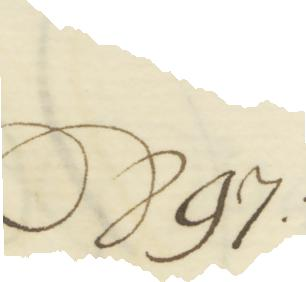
897:
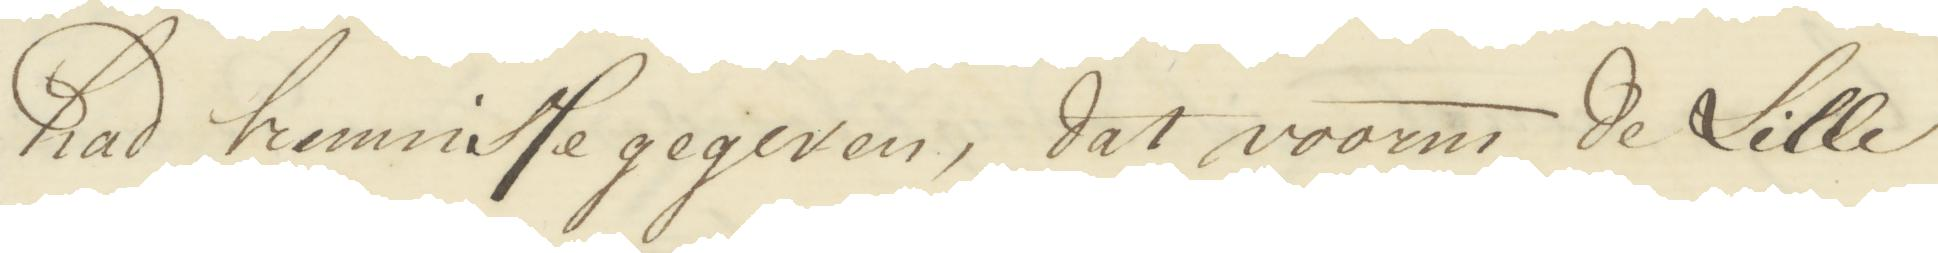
had kennisse gegeven, dat voorm de Lille
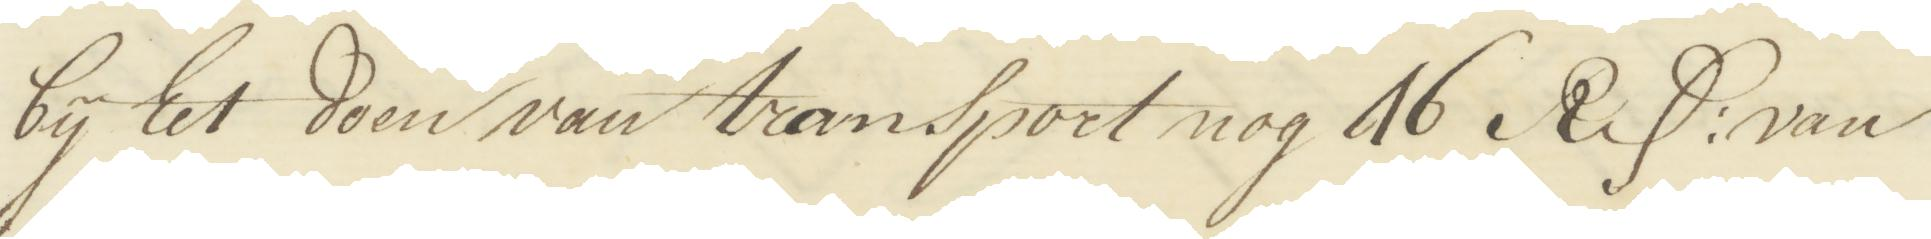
bij het doen van transport nog 46 Rds: van
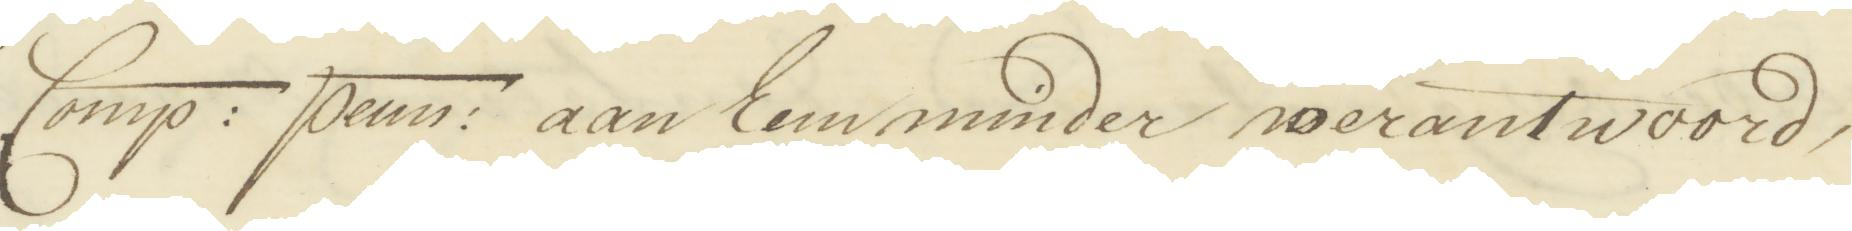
Comp: penn: aan hem minder verantwoord,
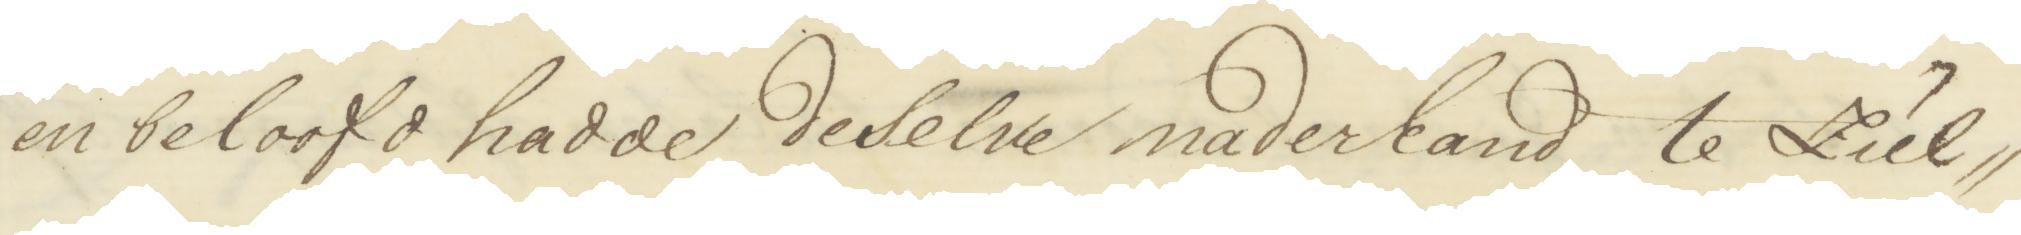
en beloofd hadde deselve naderhand te zul„
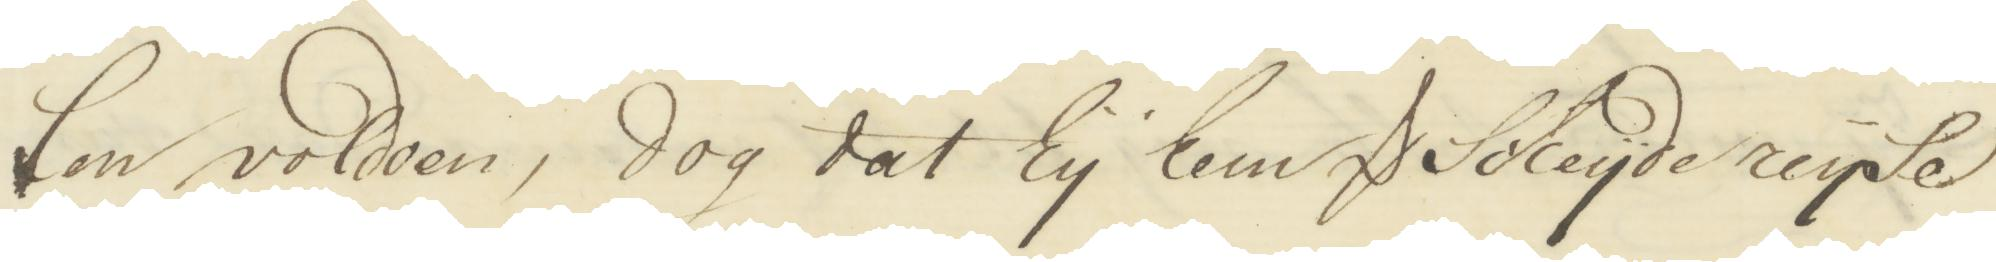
len voldoen, dog dat hij hem verscheijde reijse
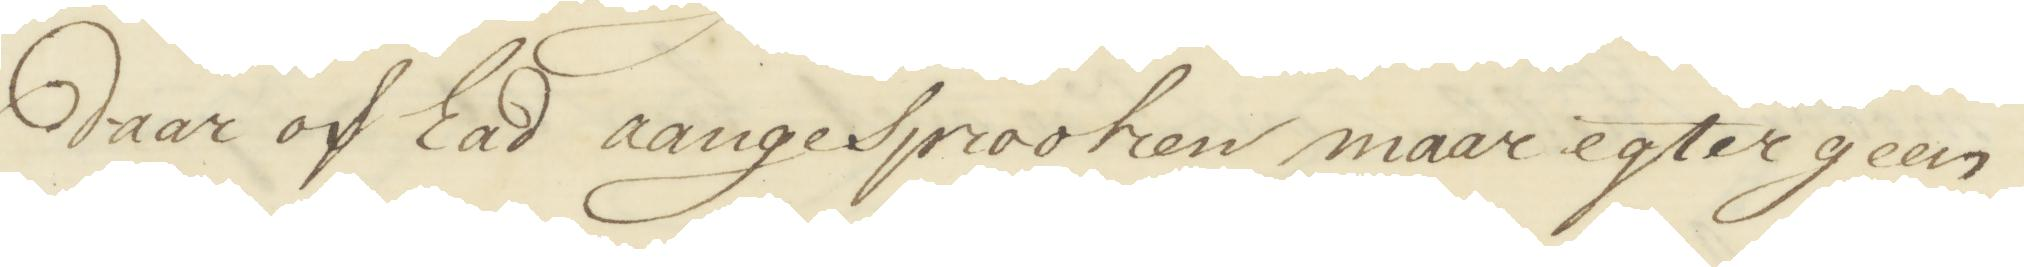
daar over had aangesprooken maar egter geen
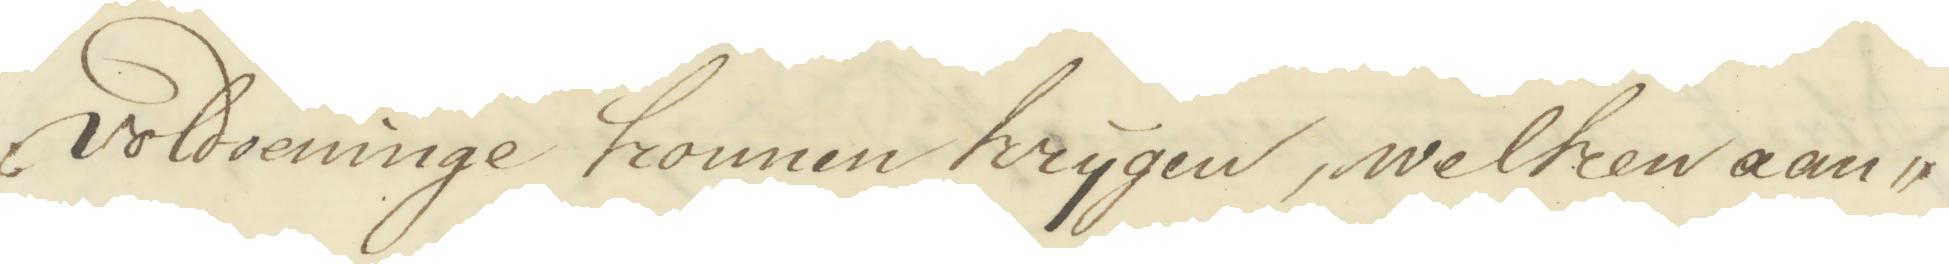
voldoeninge konnen krijgen, welken aan„
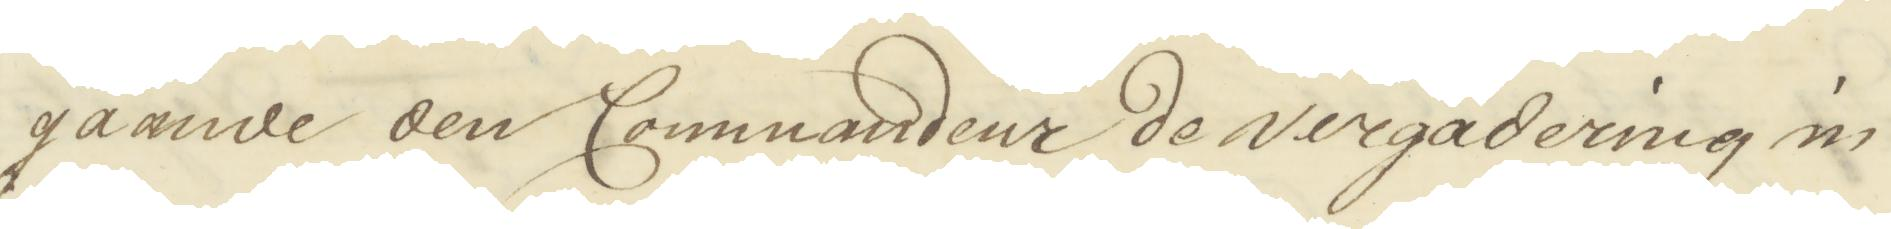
gaande den Commandeur de vergadering in
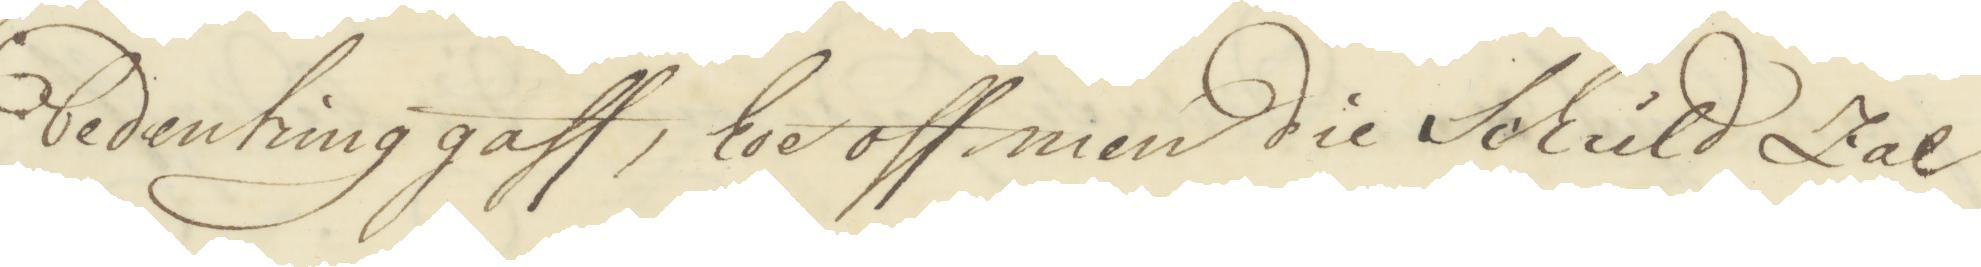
bedenking gaff, hoe off men die schuld zal
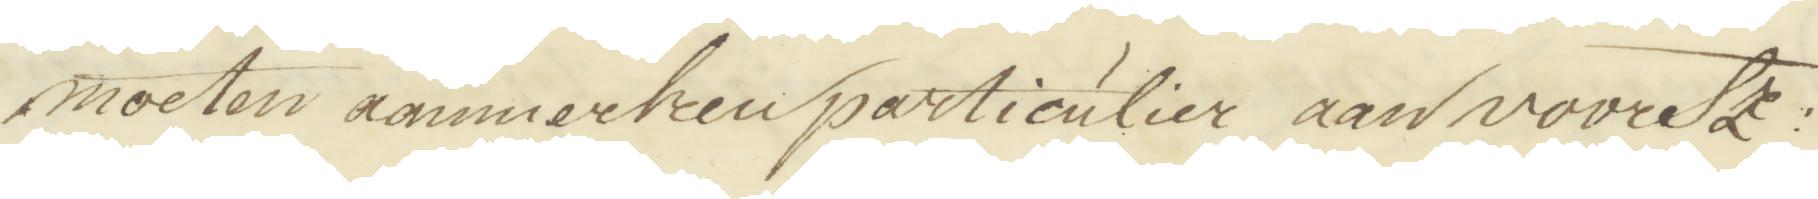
moeten aanmerken particulier aan voorsz:
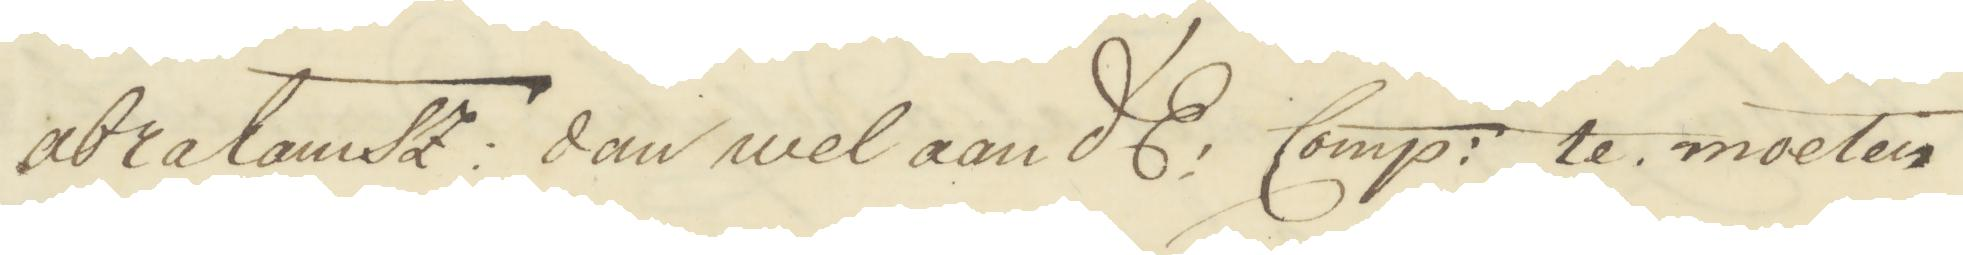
abrahamsz: dan wel aan d'E: Comp: te moeten
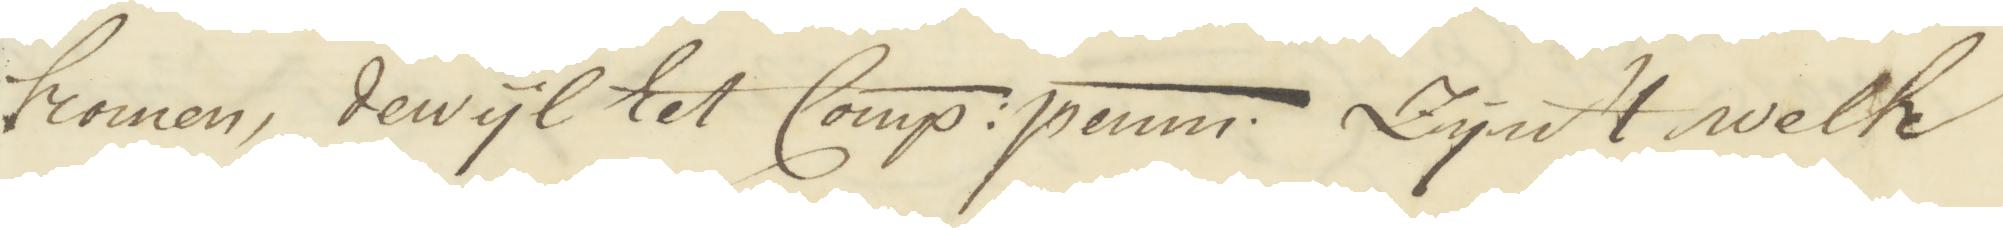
komen, dewijl het Comp: penn: zijn ’t welk
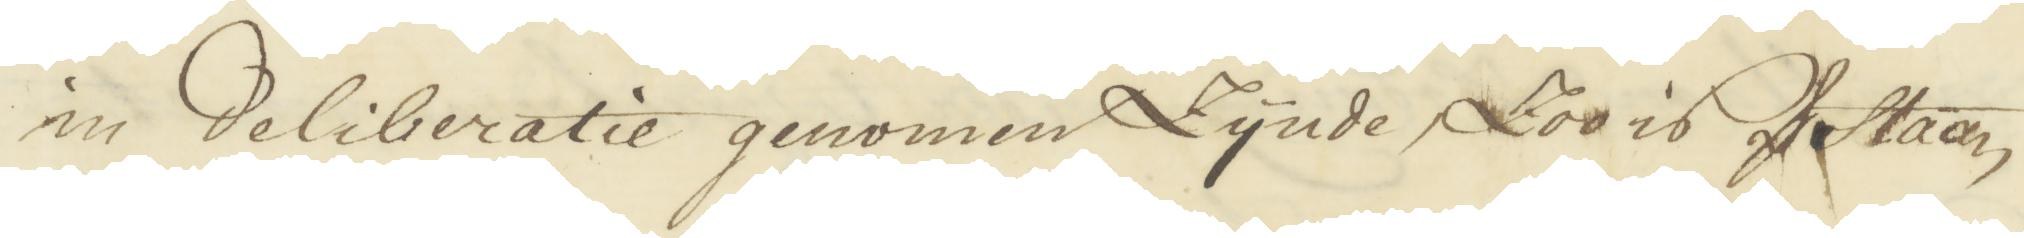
in deliberatie genomen zijnde, zoo is verstaan
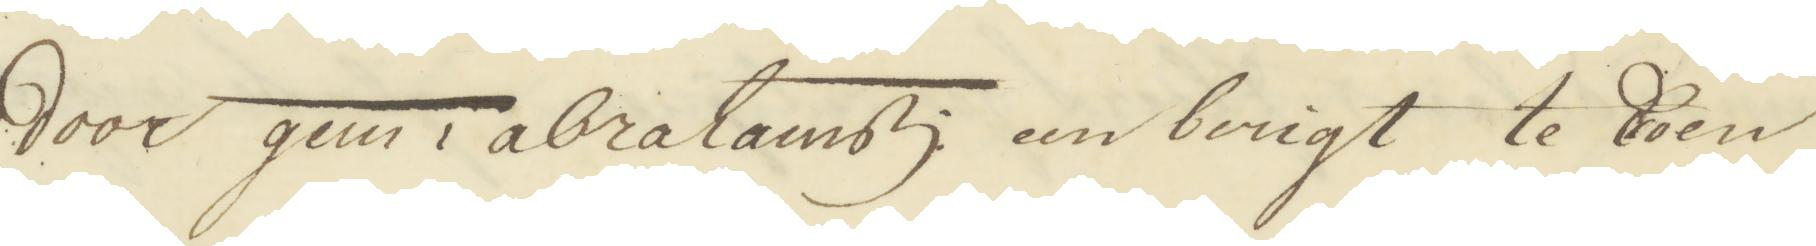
door gem: abrahams: een berigt te doen
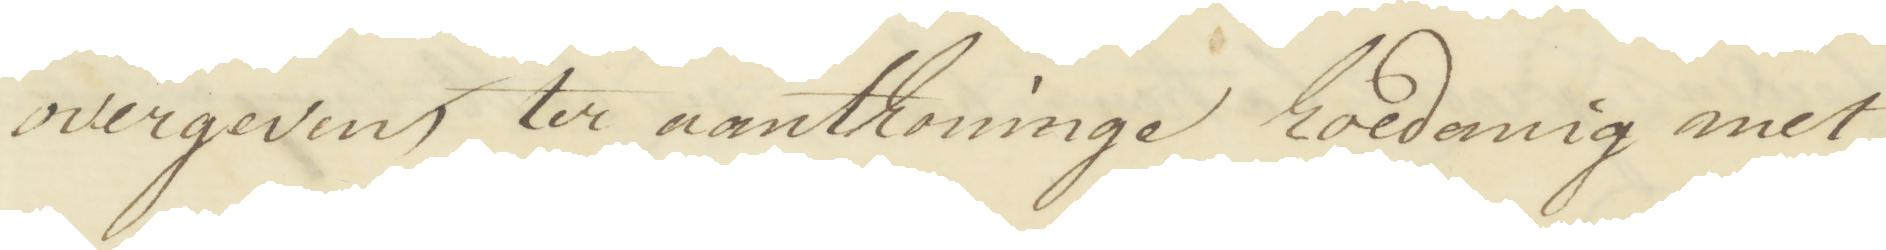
overgeven, ter aanthoninge hoedanig met
